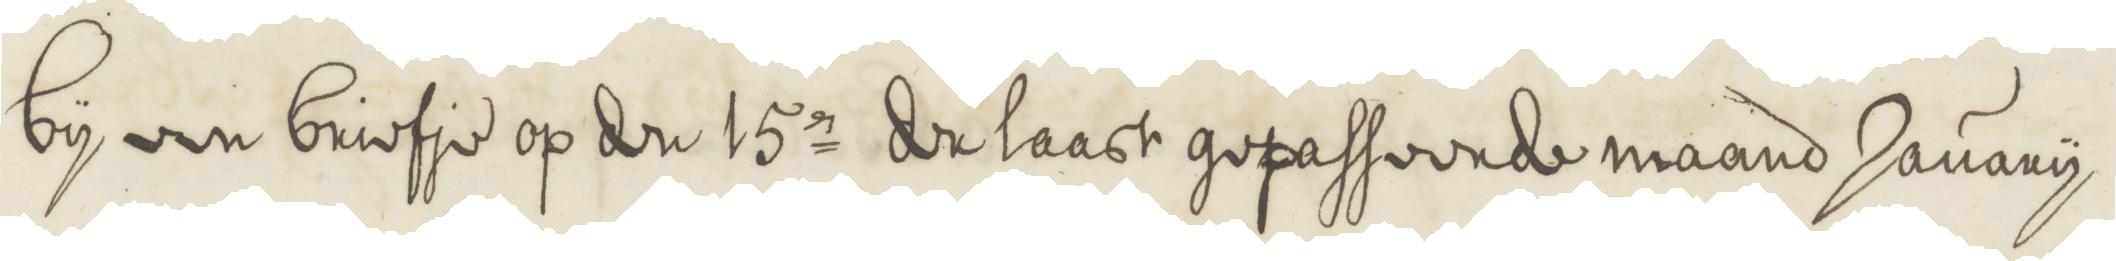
bij een briefje op den 15=en der laast gepasseerde maand Jauarij
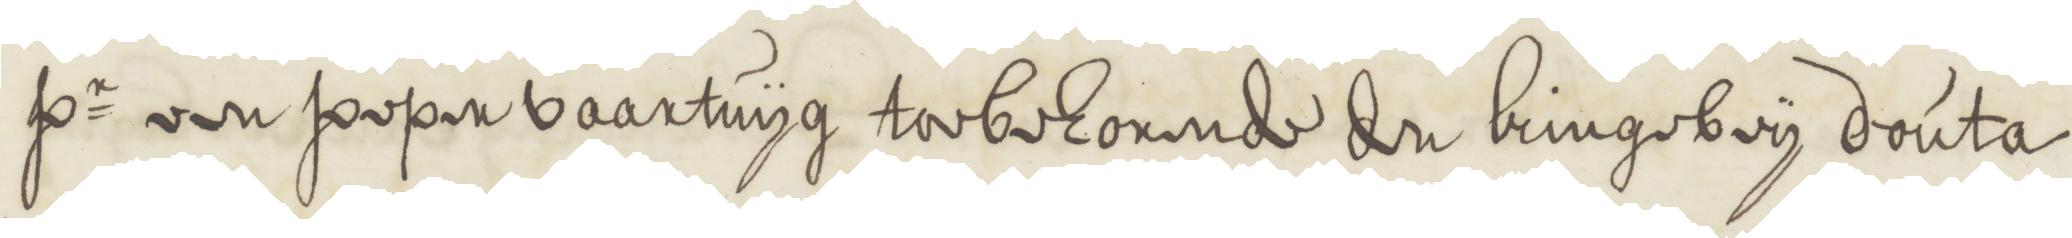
p=r een peper vaartuijg toebehorende den kingebeij douta
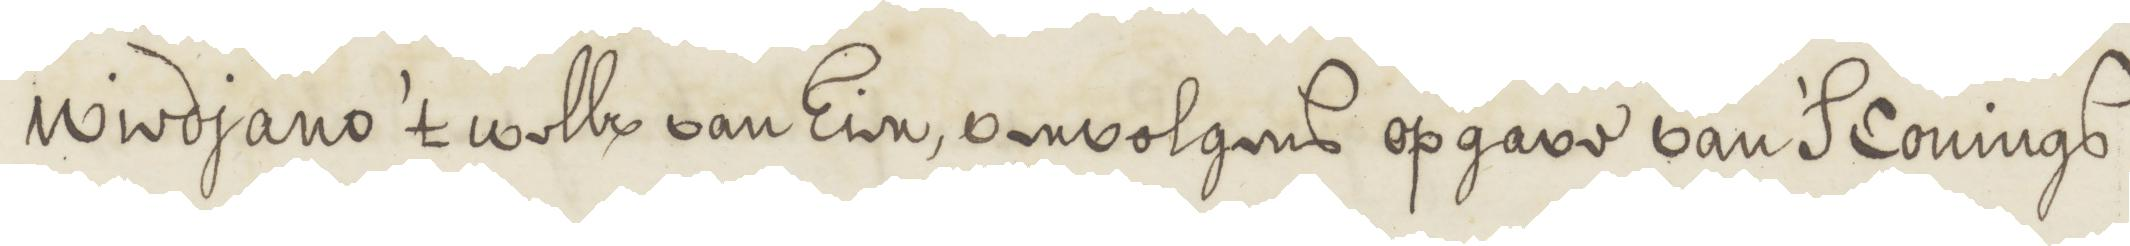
wiedjano ’t welk van hier, vervolgens opgave van ’s Conings
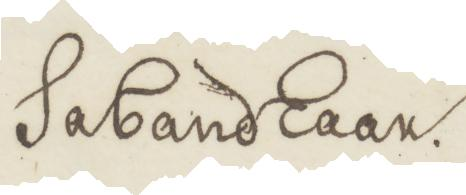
Sabandhaar.
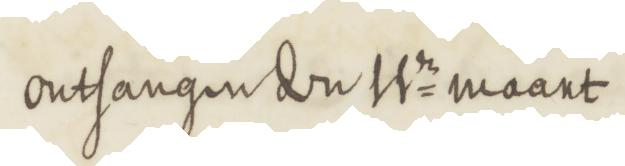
ontfangen den 11:en maart
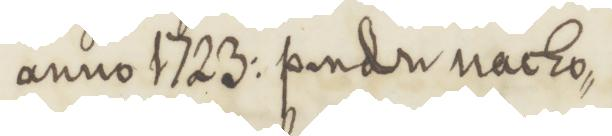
anno 1723: perden nacho„
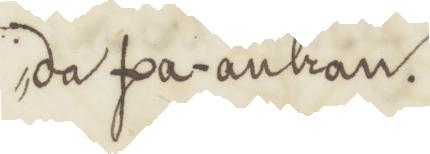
„da pa-ankan.
